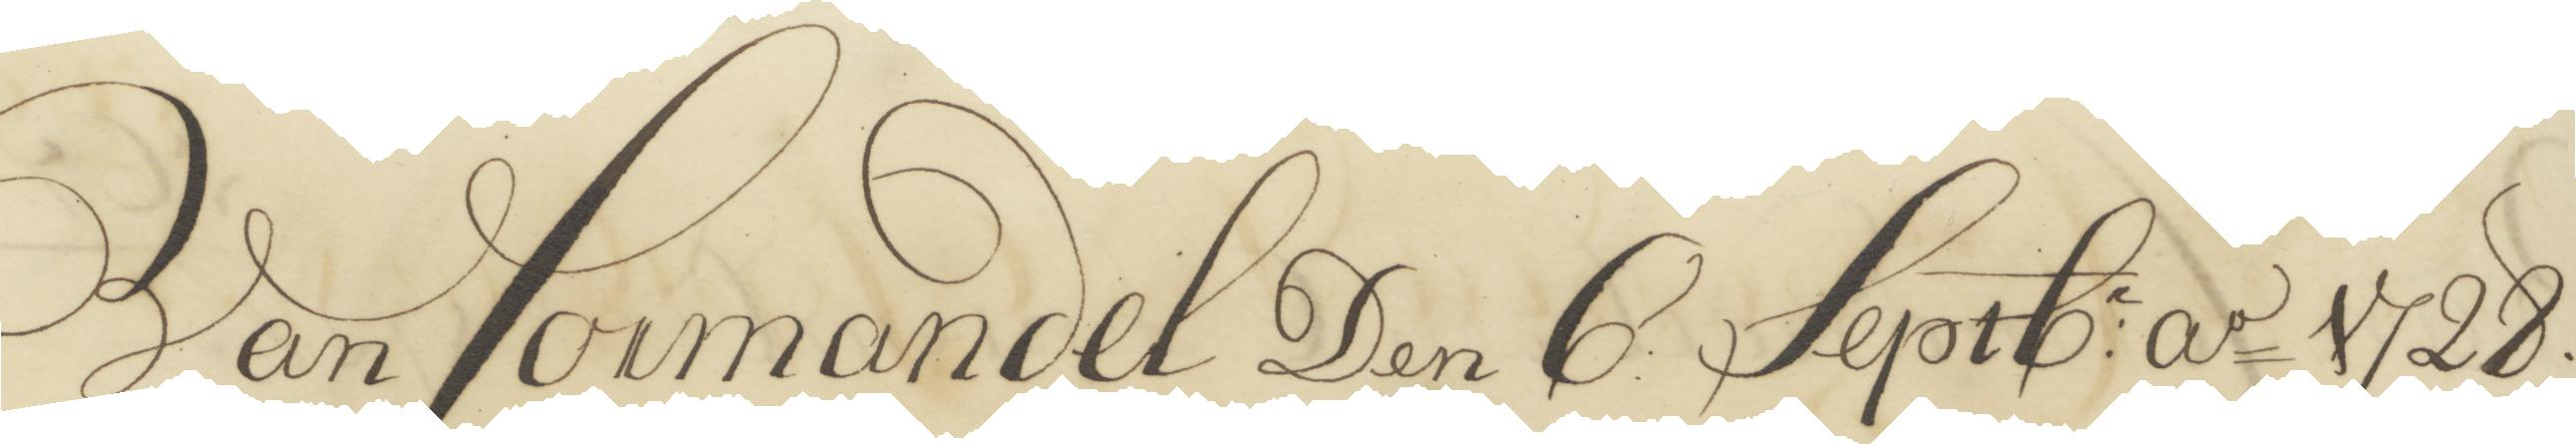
Van Cormandel Den 6:' Septb:r a:o 1728.
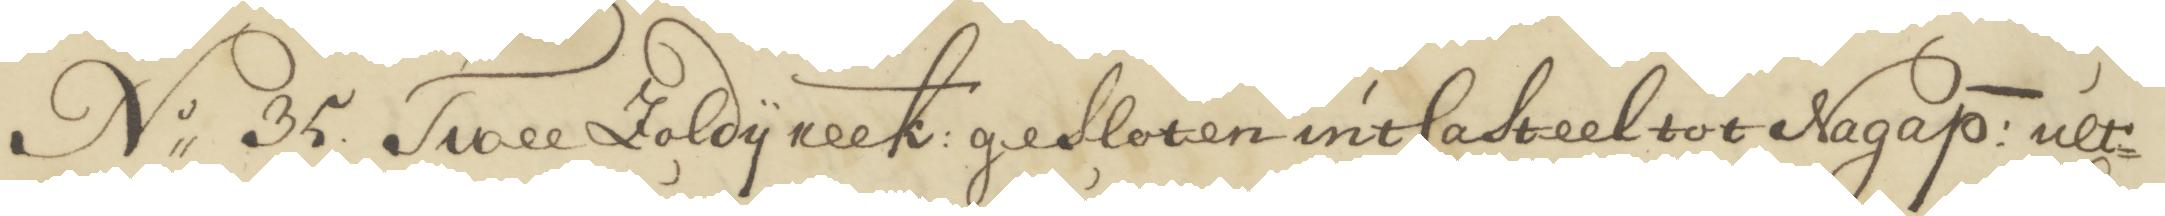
N„o 35. Twee Zoldij reek: gesloten in't Casteel tot Nagap: ult=o
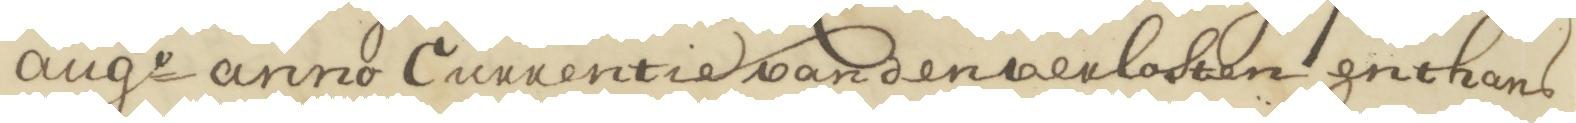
aug=o anno Currentie van den verlosten en thans
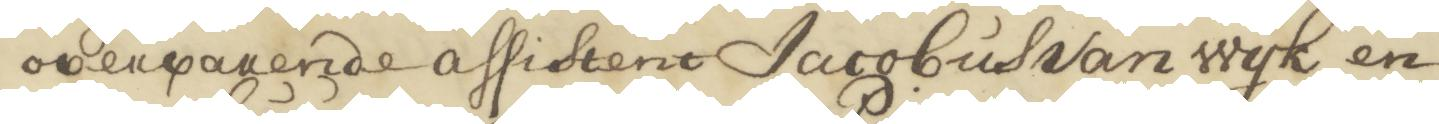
overvarende assistent Iacobus van wijk en
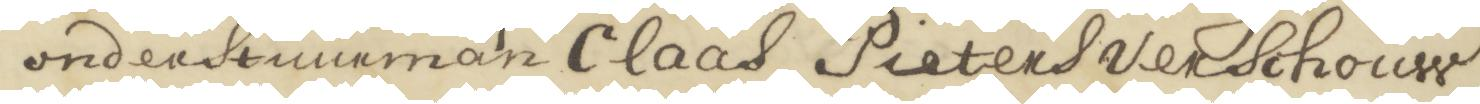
onderstuurman Claas Pieters Verschouw
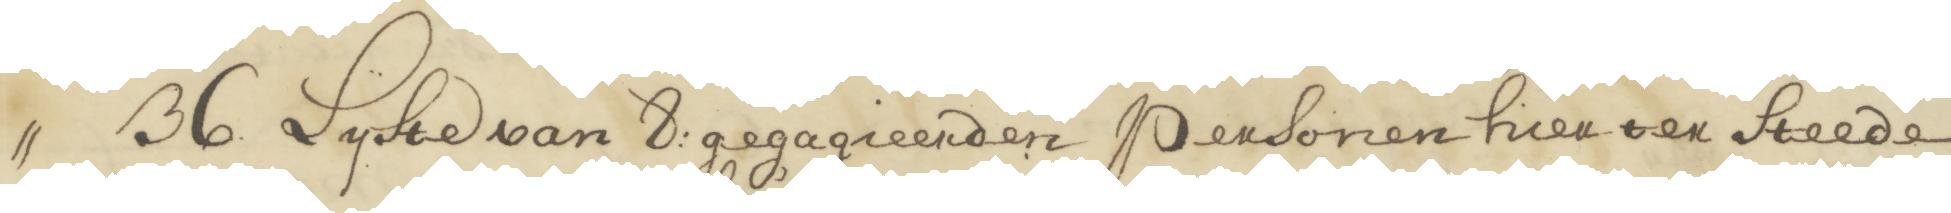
„ 36. Lijste van 8: gegagieerden Personen hier ter Steede
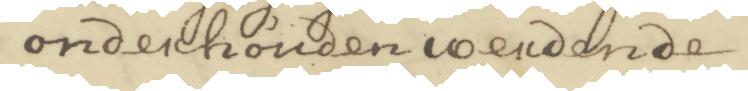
onderhouden werdende
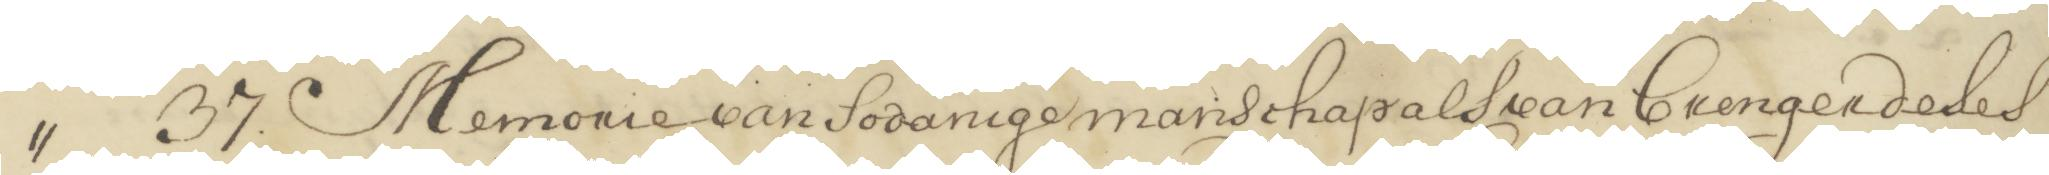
„ 37. Memorie van Sodanige manschap als van brenger deses
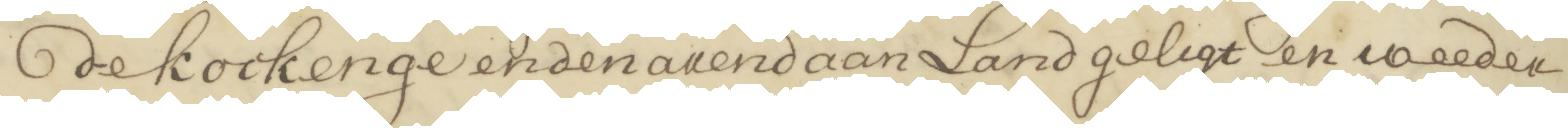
de kockenge en den arend aan Land geligt en weeder
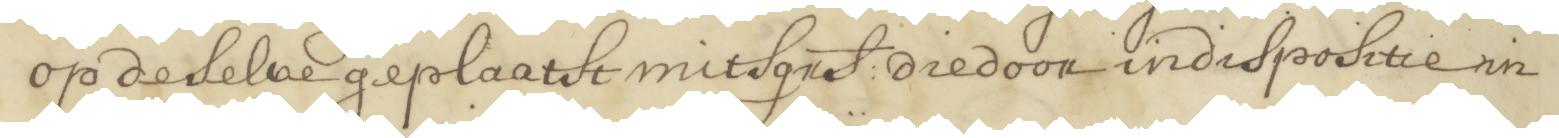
op deselve geplaatst mitsgrs: die door indispositie in
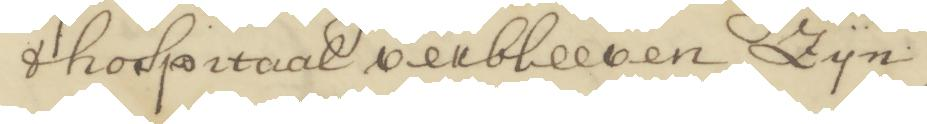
t hospitaal verbleeven Zijn
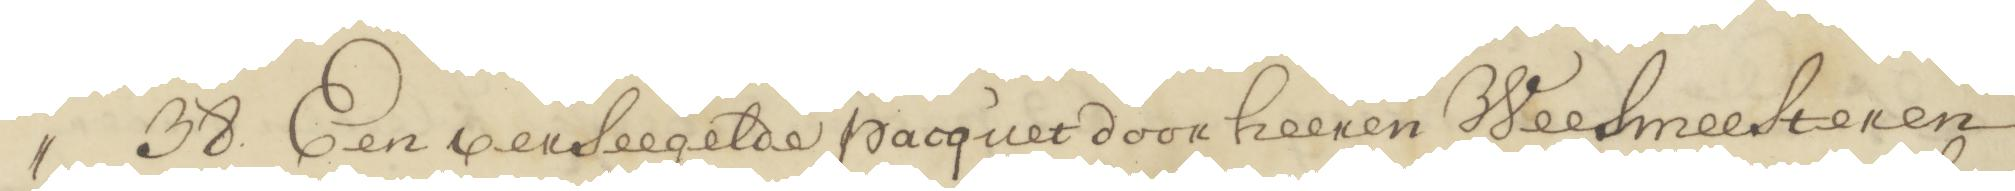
„ 38. Een verseegelde pacquet door heeren Weesmeesteren
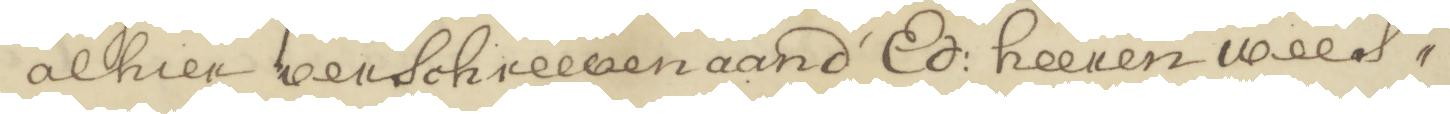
alhier verschreeven aan d’ Ed: heeren wees„
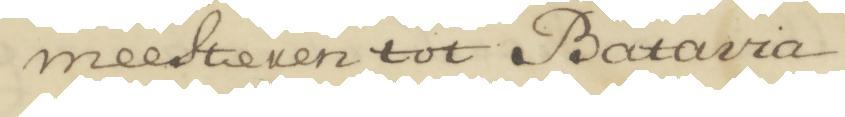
meesteren tot Batavia
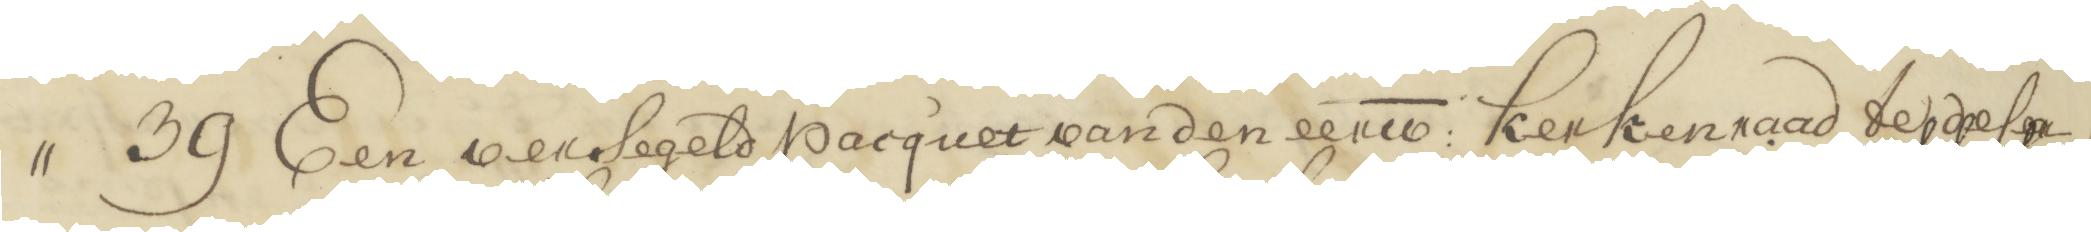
„ 39 Een versegeld pacquet van den eerw: kerken raad te deser
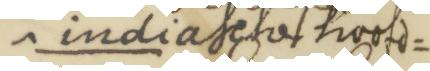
^ indiasche hoofd=
